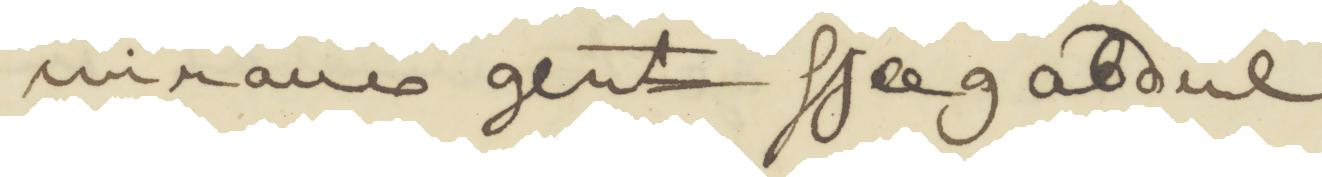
nirauw gen=t sjeeg abdul
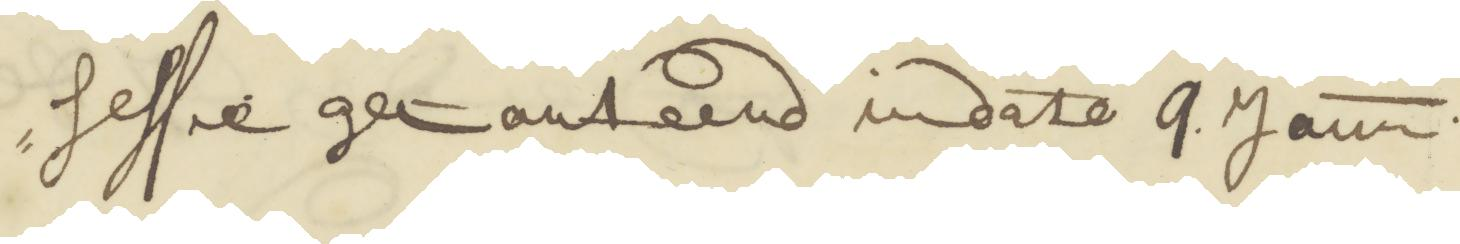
„sessie gecanteerd in dato 4. Jann
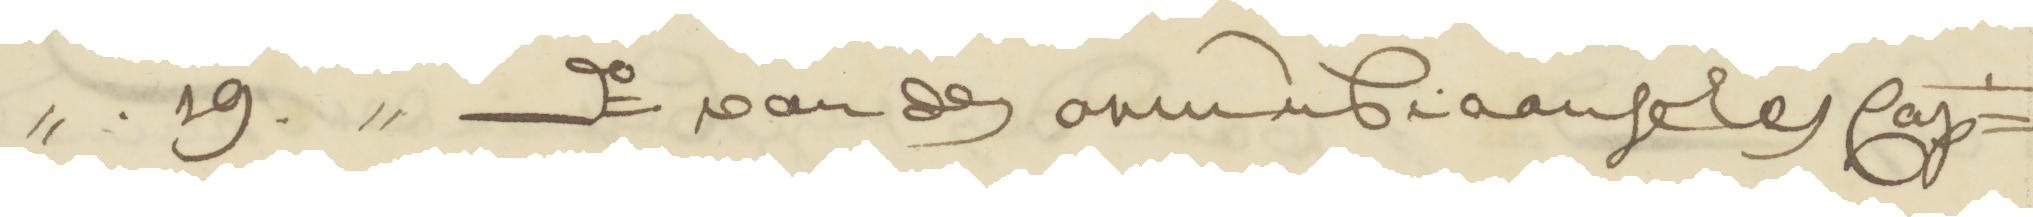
„ . 19 . „ d=o van den ormusiaanschen Cap=t
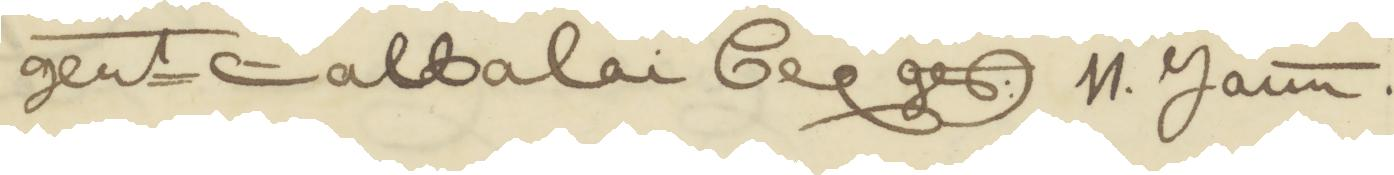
gen=t calbalai bex ges:z 11. Jann
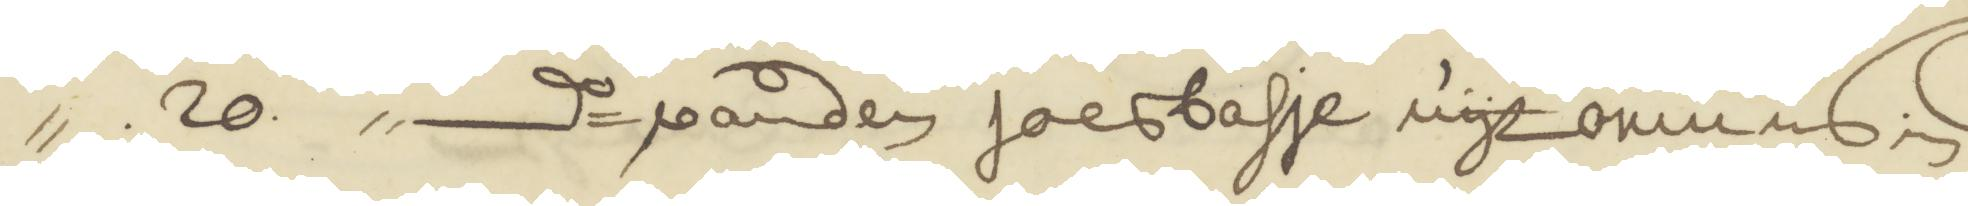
„ . 20. „ d=o vanden joesbasje uijt ormus in
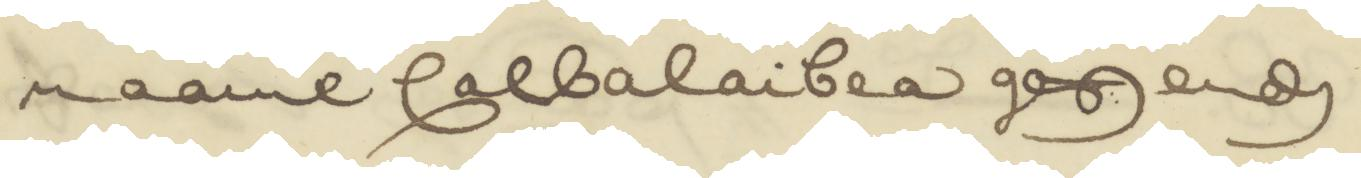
naame Calbalaibea ges:z enden
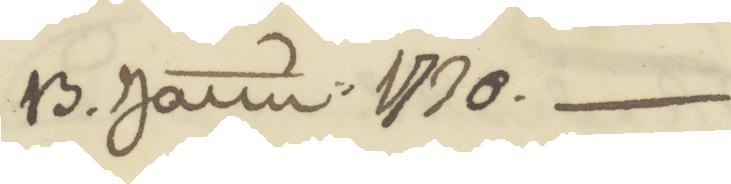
13. Janu: 1730. —
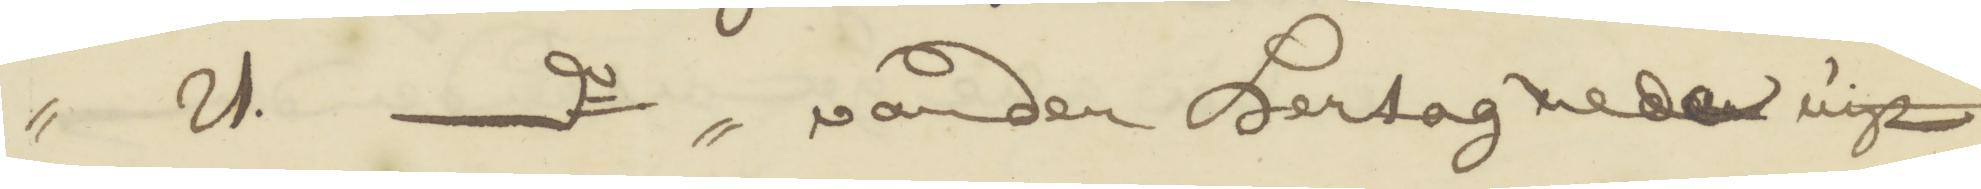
„ 21. d=o „ van den hertog nede uijt
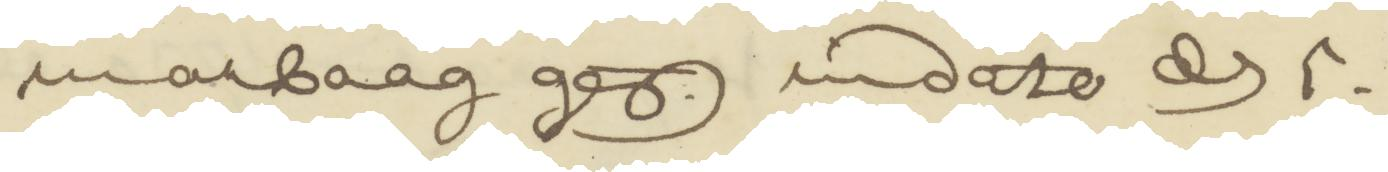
morbaag ges:z in dato den 5.
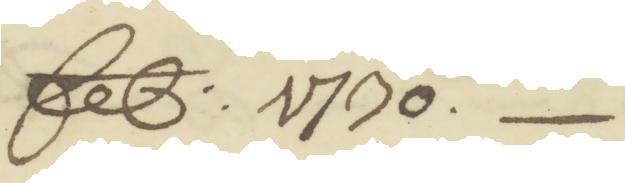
feb: 1730. —
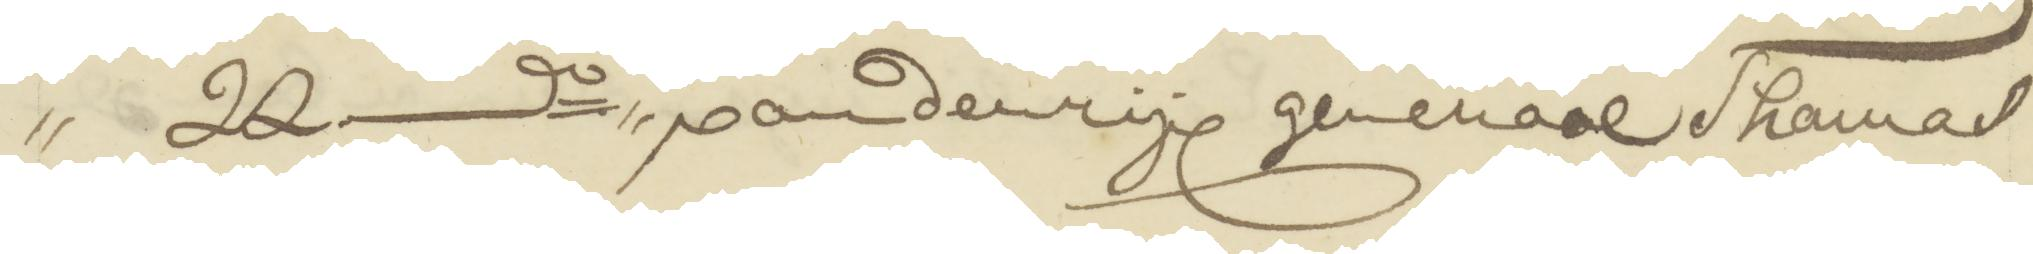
„ 22. d=o „ van den rijx genenaal Thomas
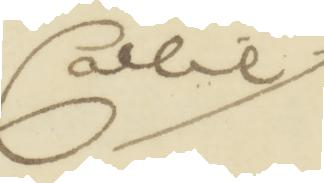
Coelie
